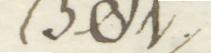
381:
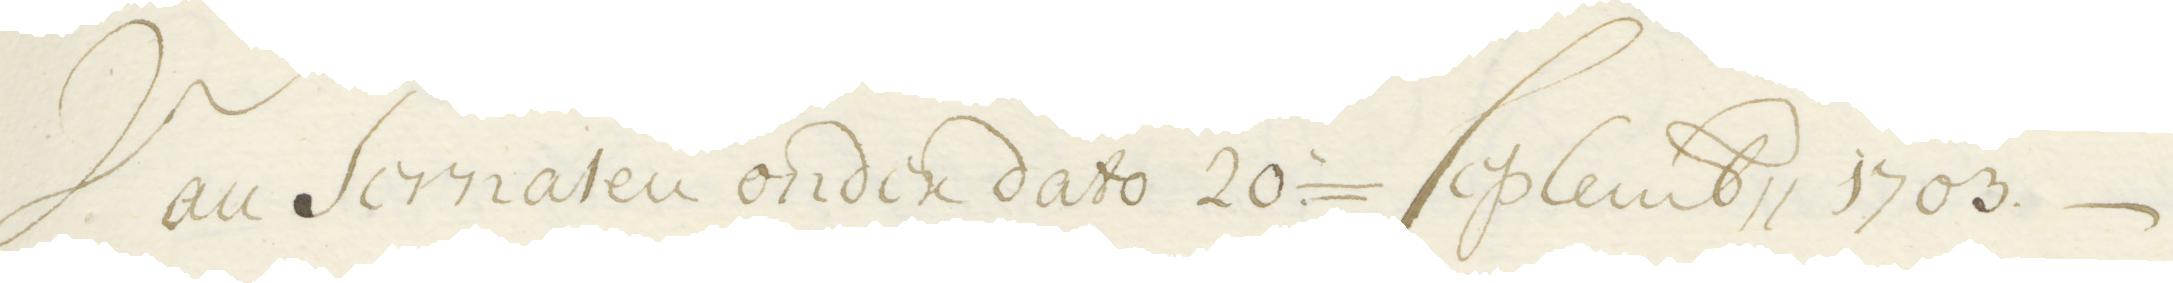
Van Ternaten onder dato 20.=' Septemb„ 1703. —
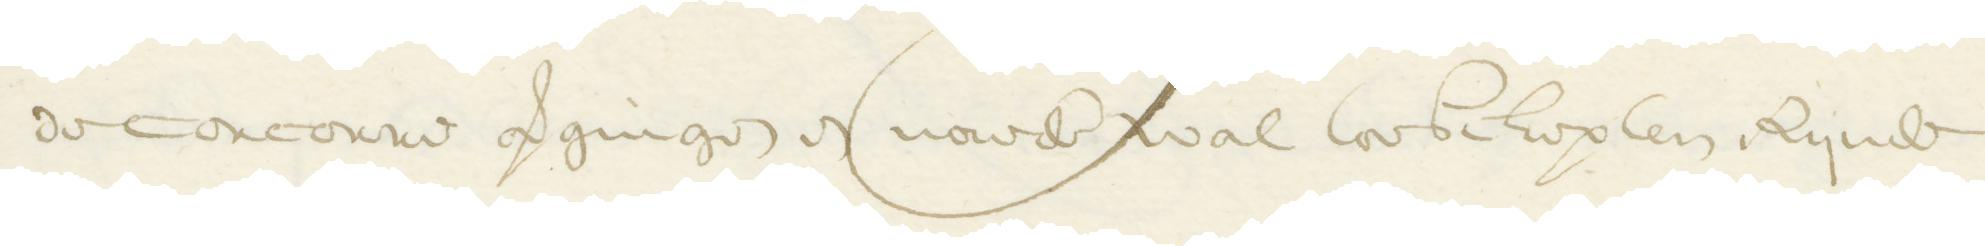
de corcorre overgingen en naede wal toeschepten, zijnde
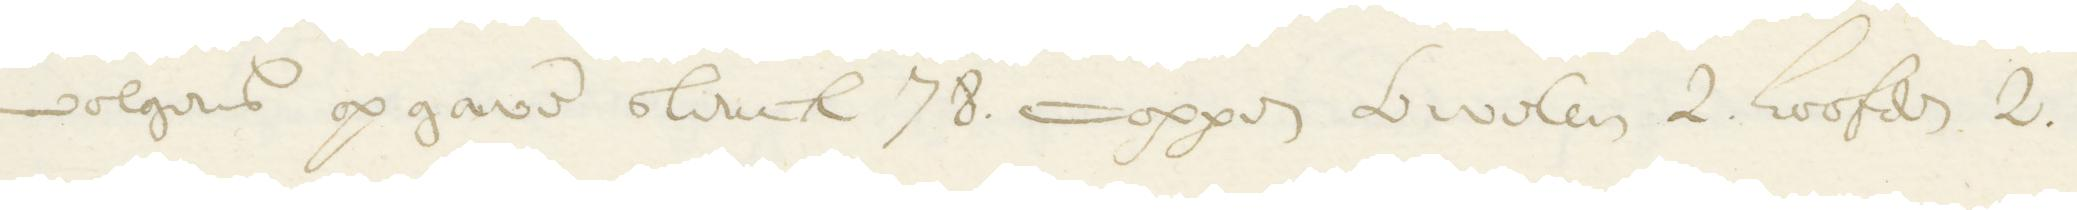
volgens op gave sterck 78. coppen te weten 2. hoofden 2.
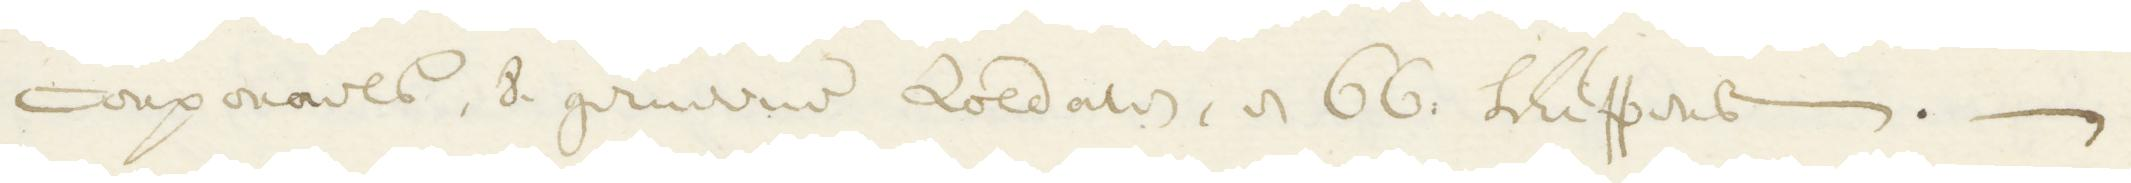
corporaels, 8. gemeene zoldaten, en 66: scheppers. —
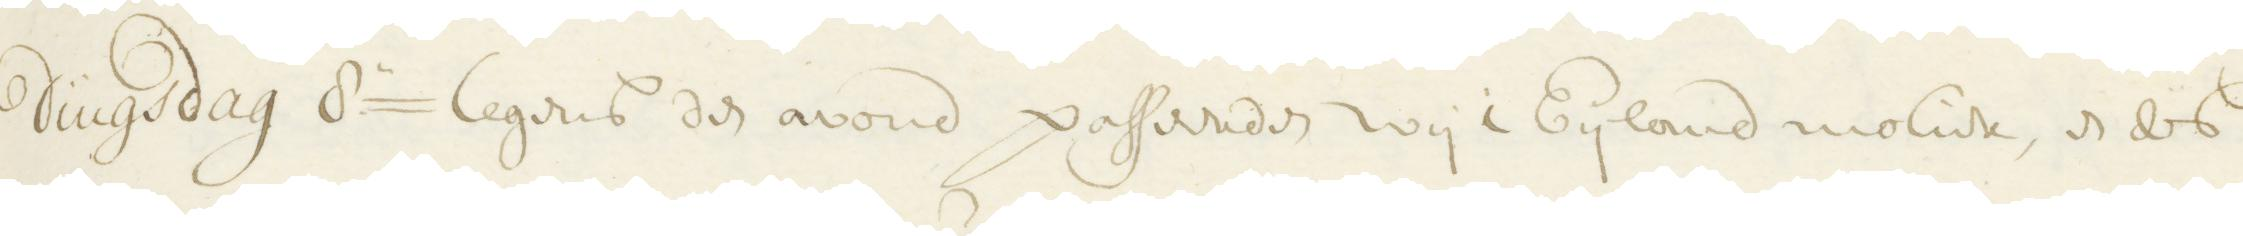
dingsdag 8.=n tegens den avond passeerden wij ’t Eijland motier, en des
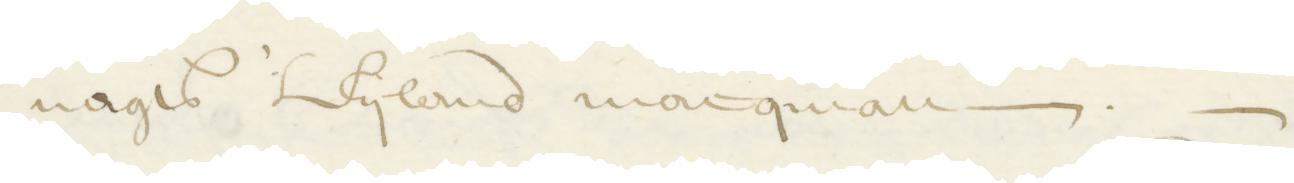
nagts 't Eijland macquian —. —
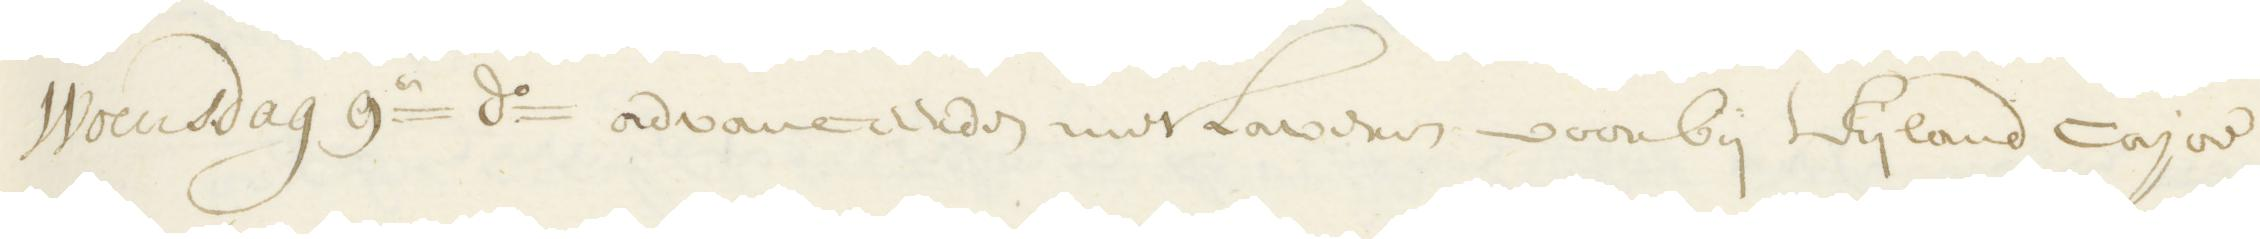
Woensdag 9.=en d.=o advanceerden met laveren voorbij 't Eijland cajoe
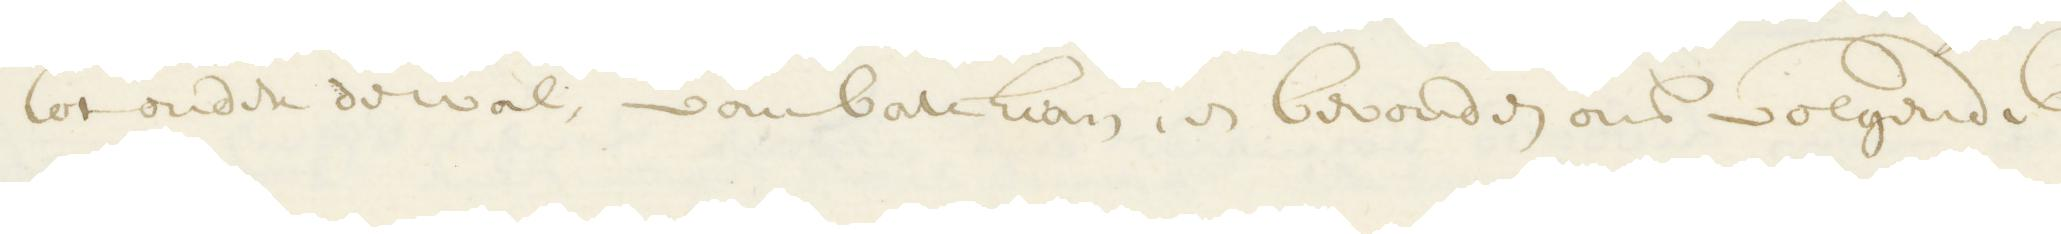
tot onder dewal; van batchian, en bevonden ons volgende
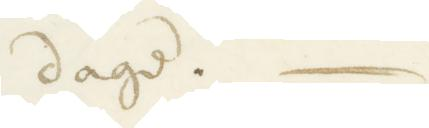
dage. —
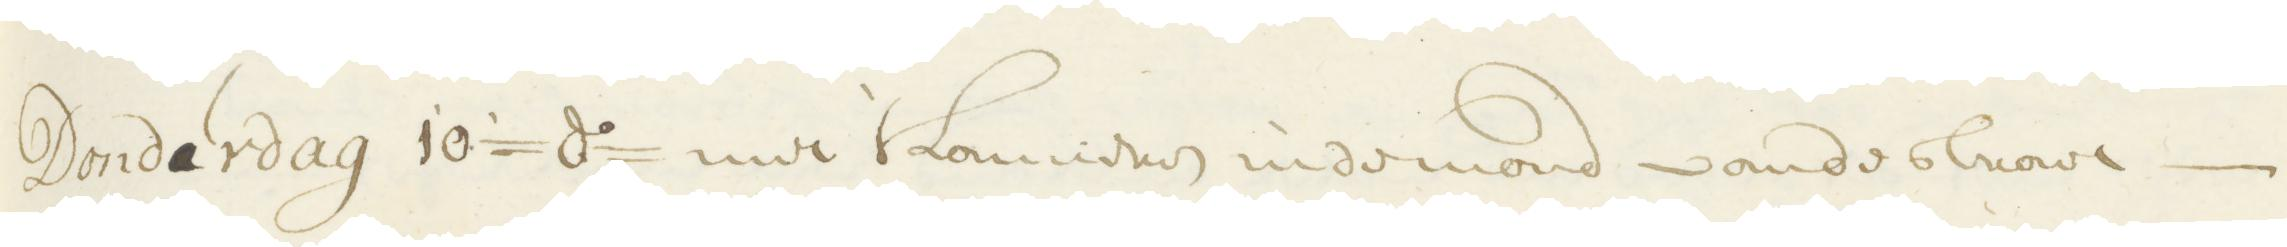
Donderdag 10.=' d=o met 't Lavieren in de mond van de straet —
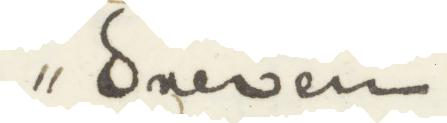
„ dreven
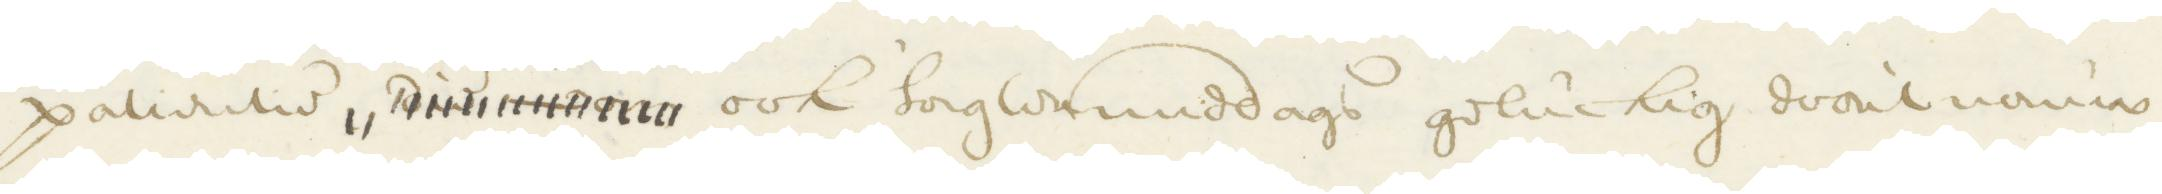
patientie „ ook 'sagtermiddags geluckig door ’t nauw
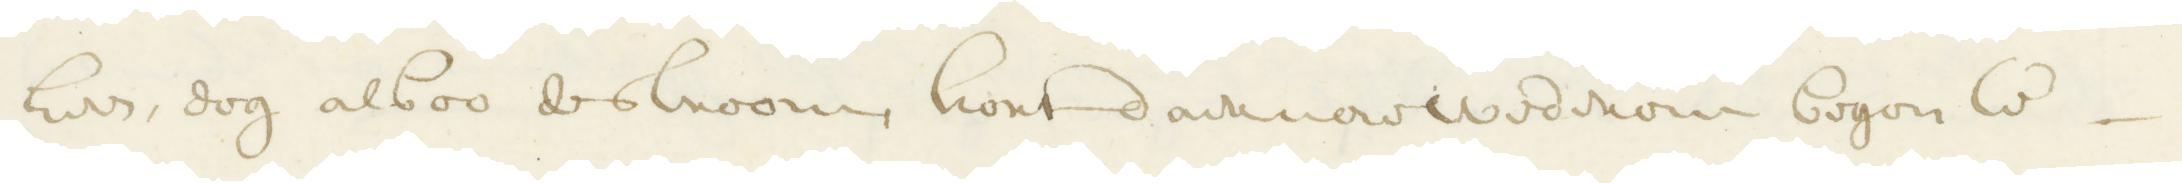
heen, dog alsoo de stroom, kort daernae wederom begon te
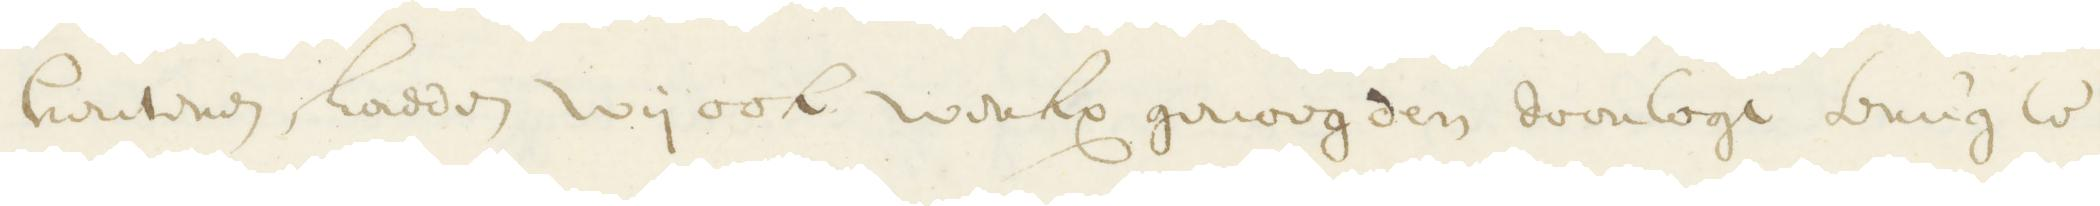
kenteren, hadden wij ook werkx genoeg den doortogt terug te
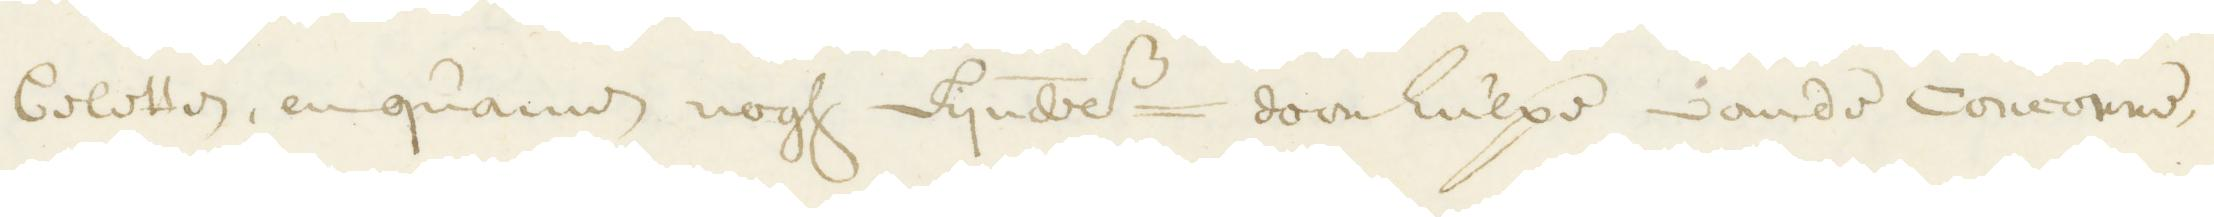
beletten, en quamen nogh Eijndelijk door hulpe vande corcorre,
